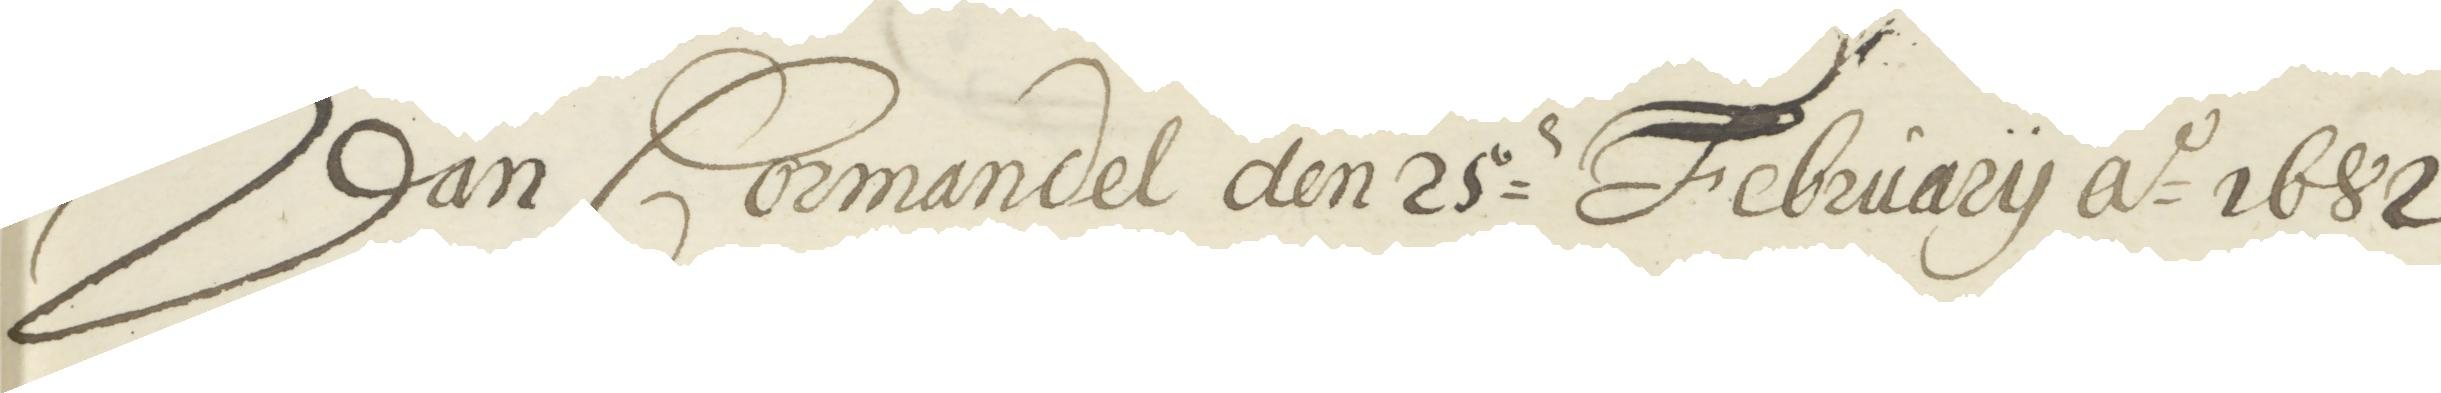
Van Cormandel den 25:e Februarij a:o 1682
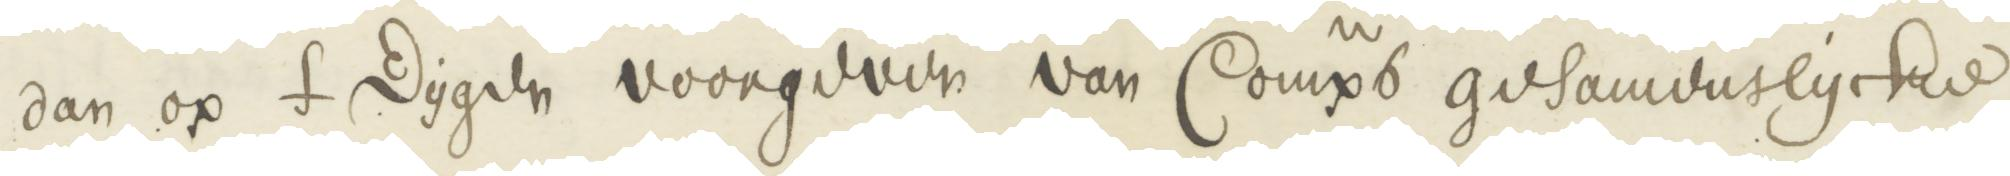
dan op ’t Eijgen voorgeven van Comps gesamentlijcke
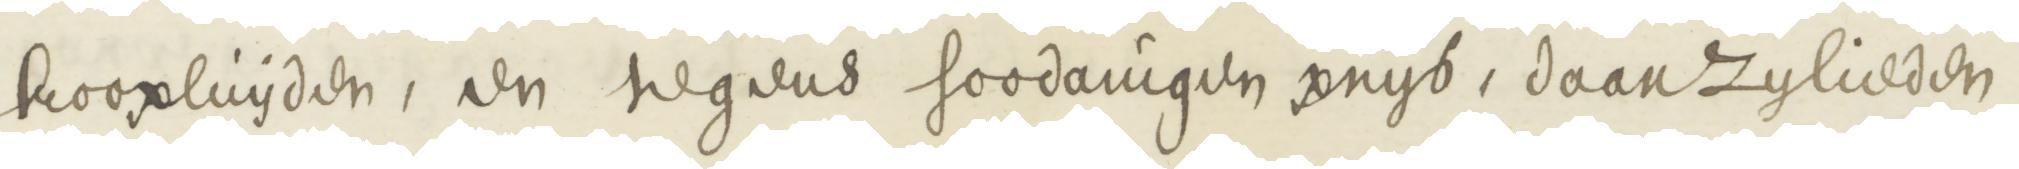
koopluijden, en tegens soodanigen prijs, daar Zylieden
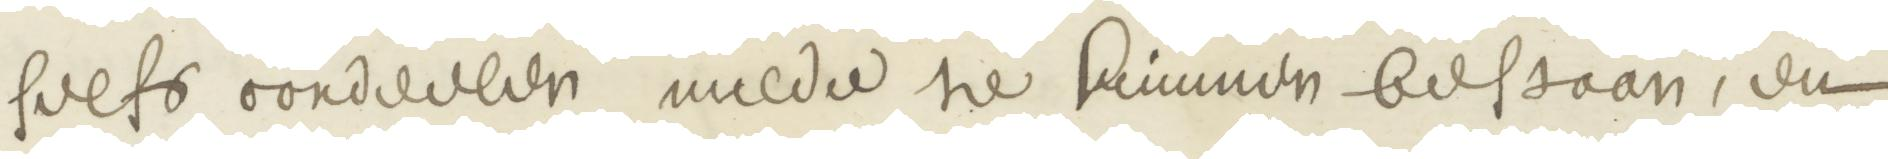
selfs oordeelen meede te kunnen bestaan, en
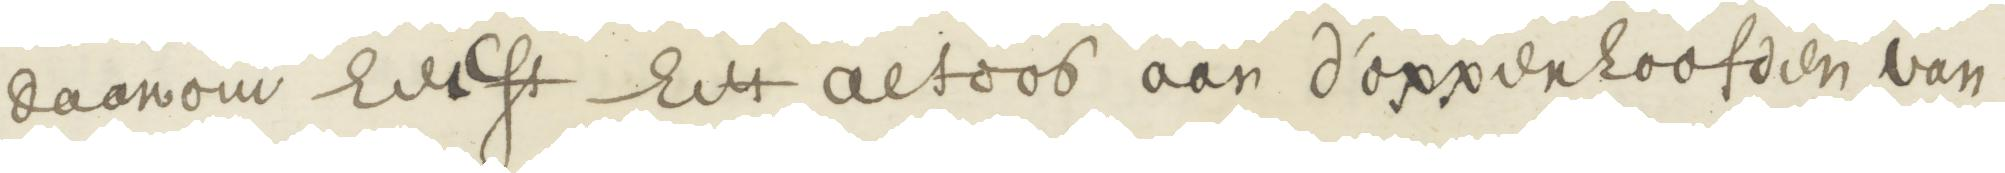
daarom heeft het altoos aan d'opperhoofden van
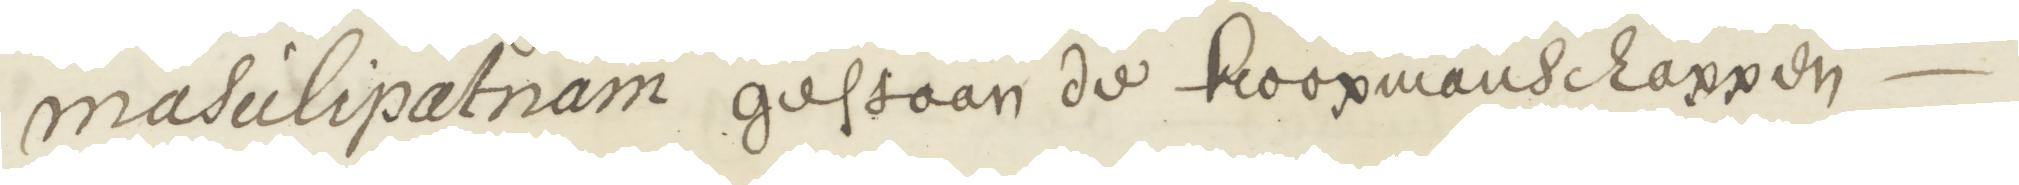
masulipatnam gestaan de koopmanschappen-
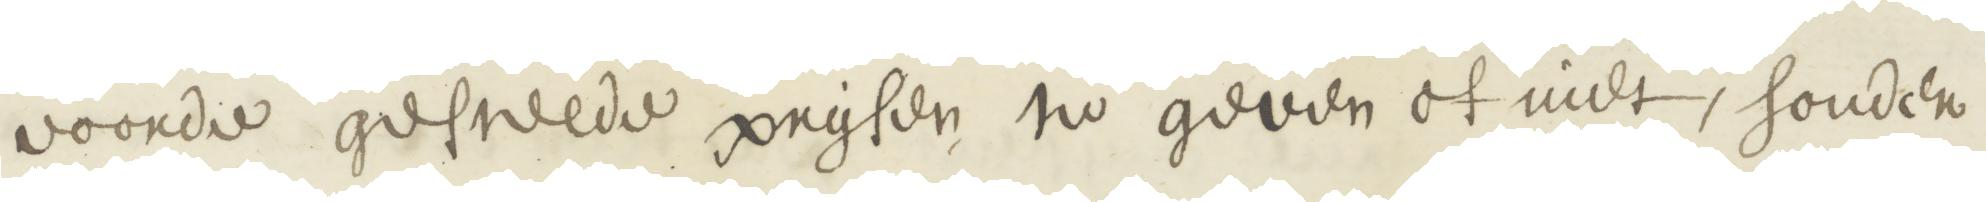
voorde gestelde prijsen te geven of niet, sonder
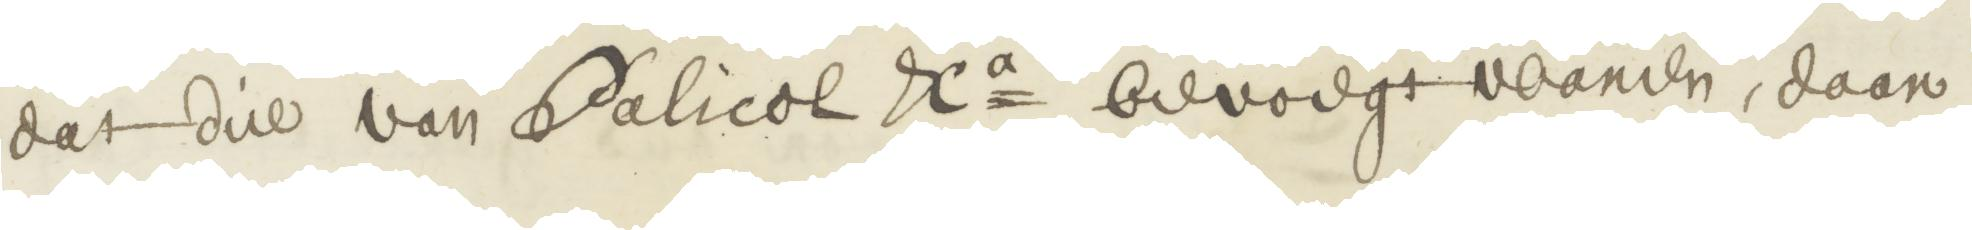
dat die van Palicol &=a bevoegt waren, daar
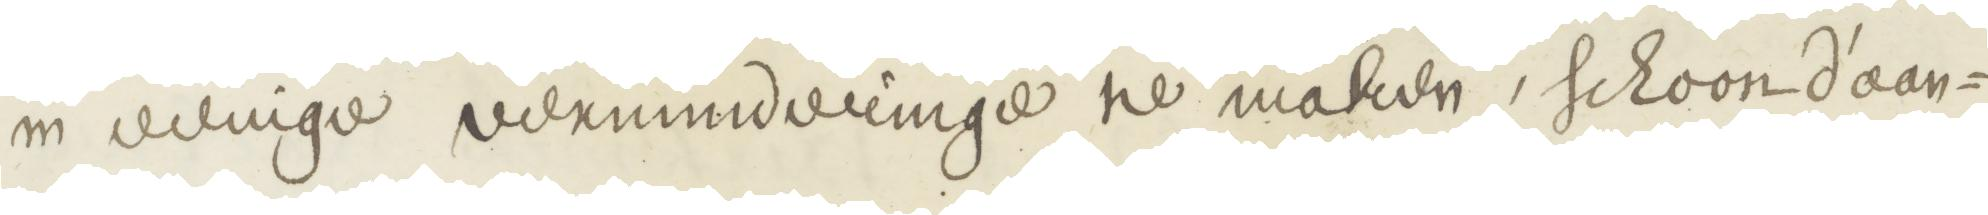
in eenige verminderinge te maken, schoon d’aan=
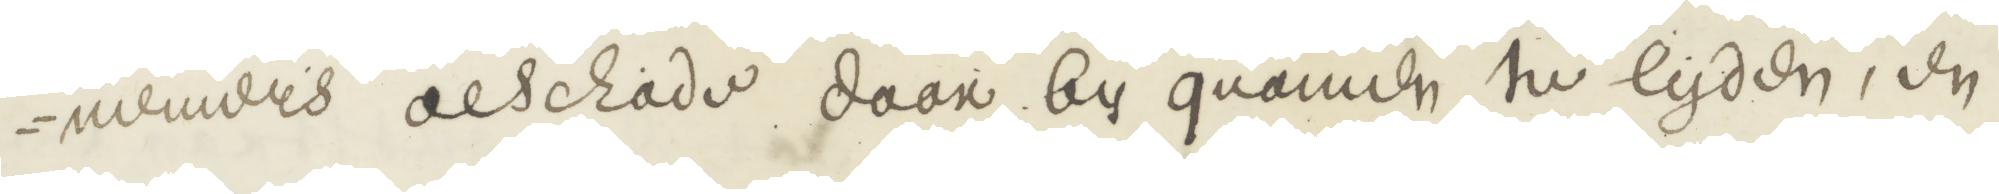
nemers al schade door by quamen te lijden, en
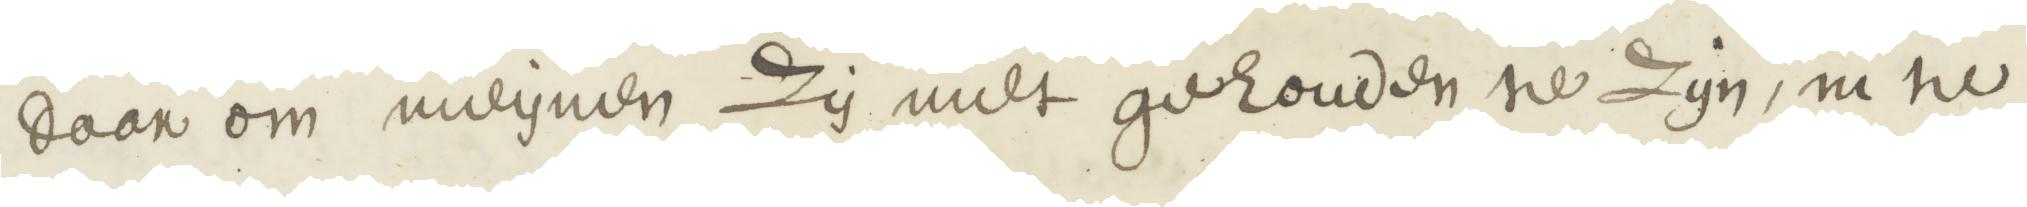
daar om meijnen Zij niet gehouden te Zijn, in te
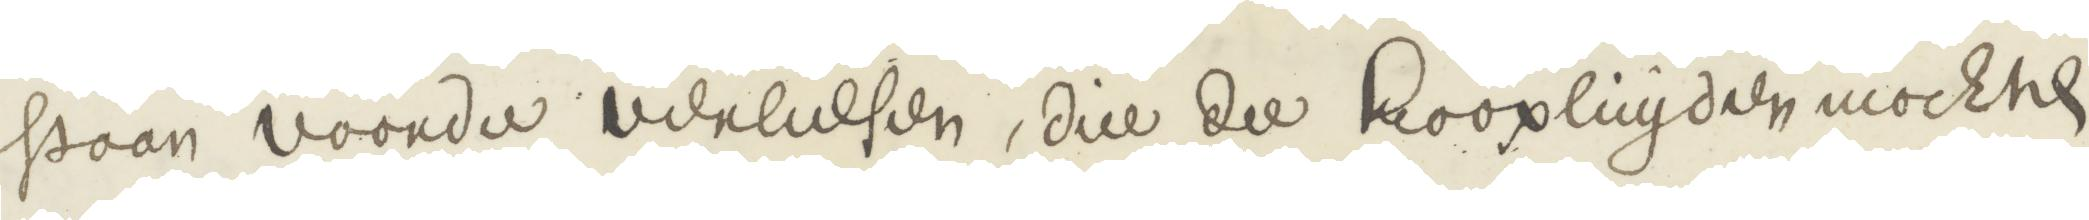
staan voorde verliesen, die de koopluijden mochten
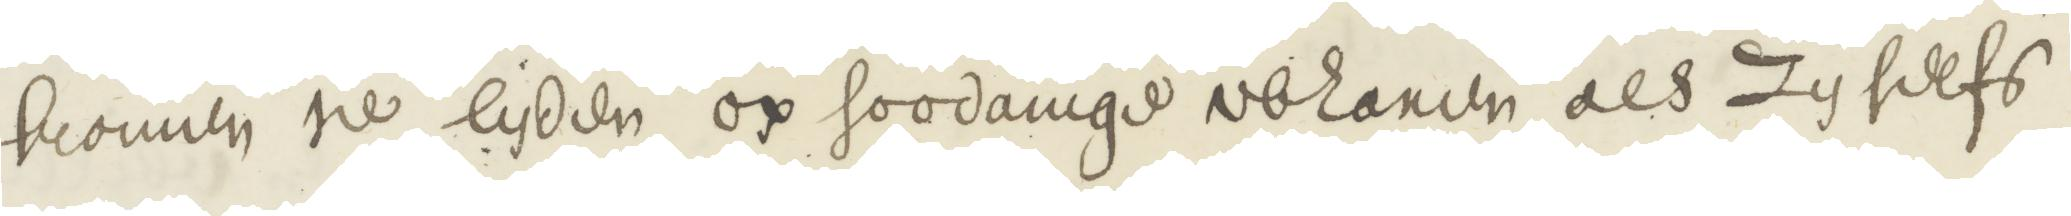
komen te lijden op soodanige wharen als Zy selfs
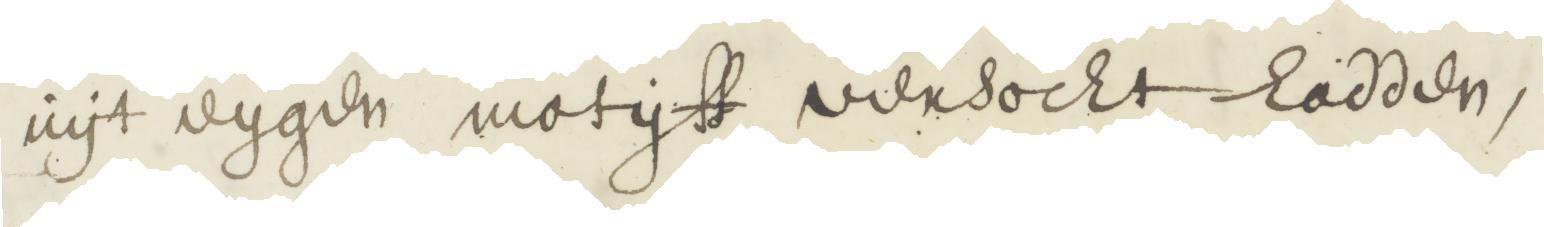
uijt eijgen motijff versocht hadden,
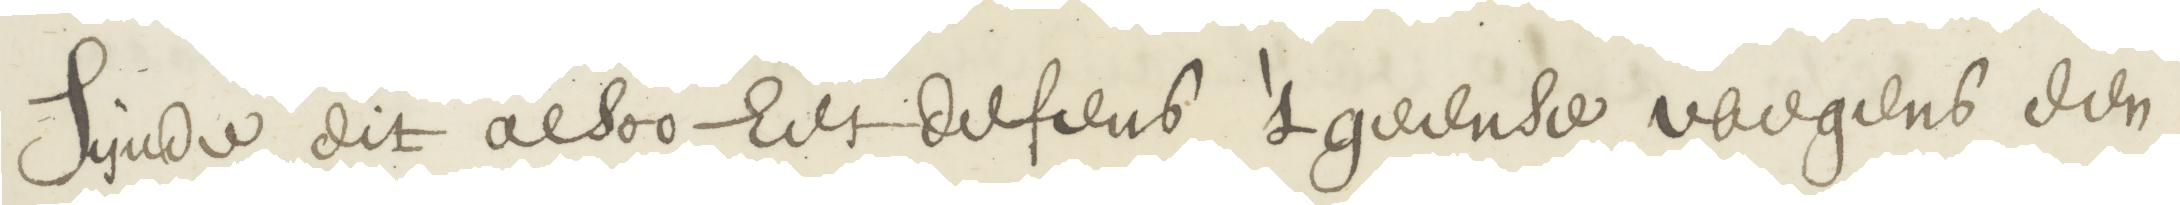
Sijnde dit alsoo het desens ’t geen se wegens een
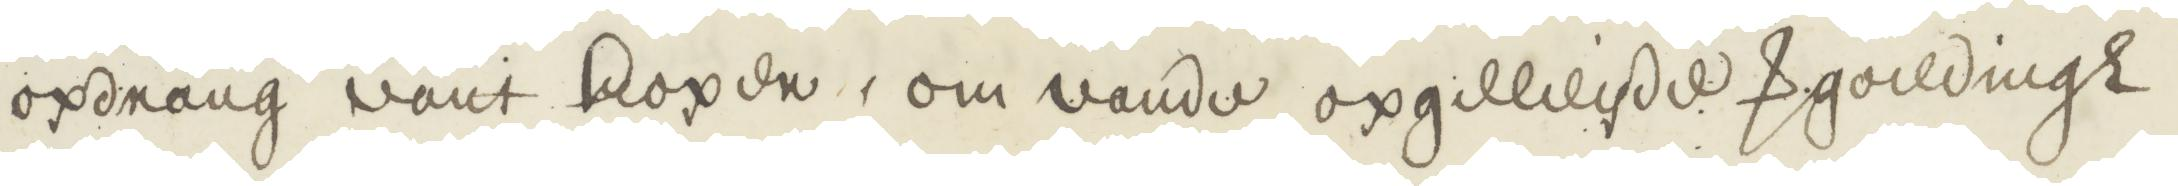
opdrang vant koper, om vande opgeleijde vergoedingh
